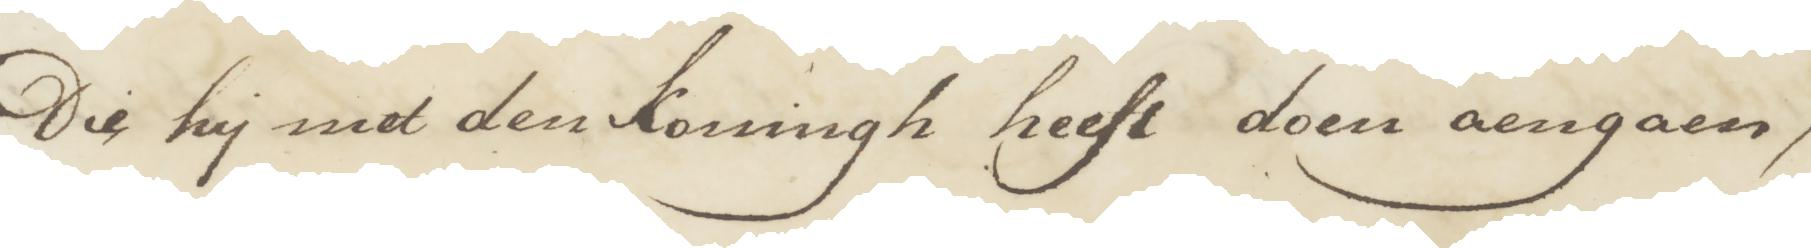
die hij met den koningh heeft doen aengaen,
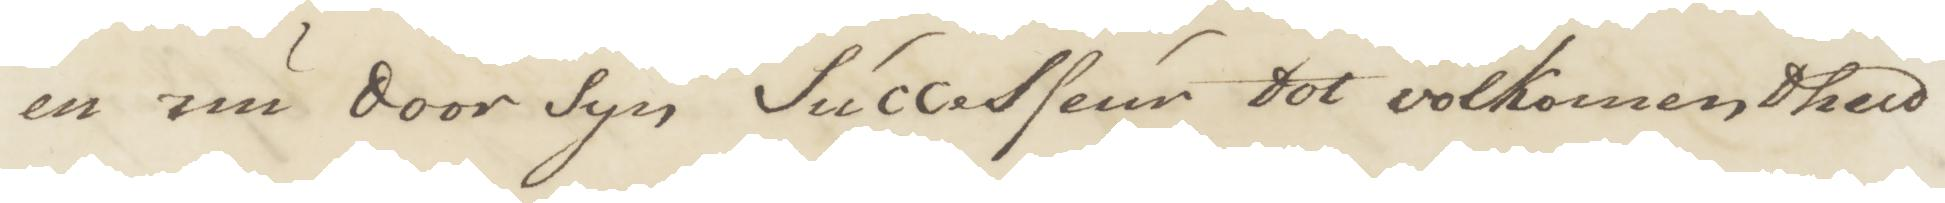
en nu door syn successeur tot volkomentheid
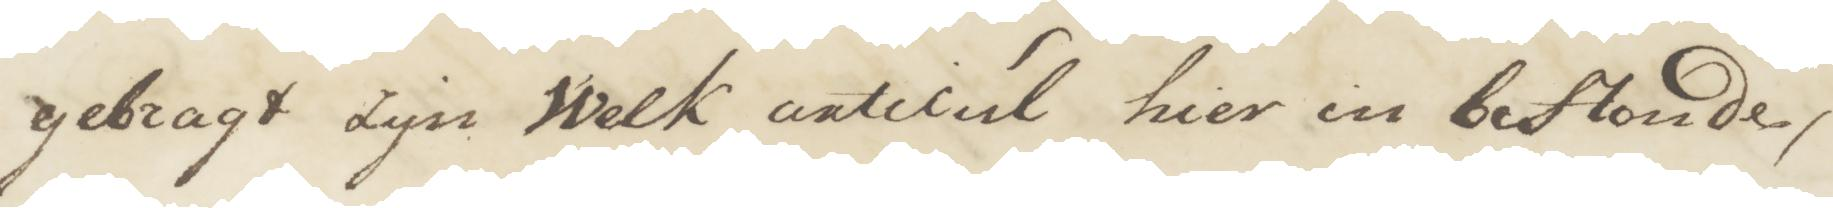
gebragt zijn welk articul hier in bestonde,
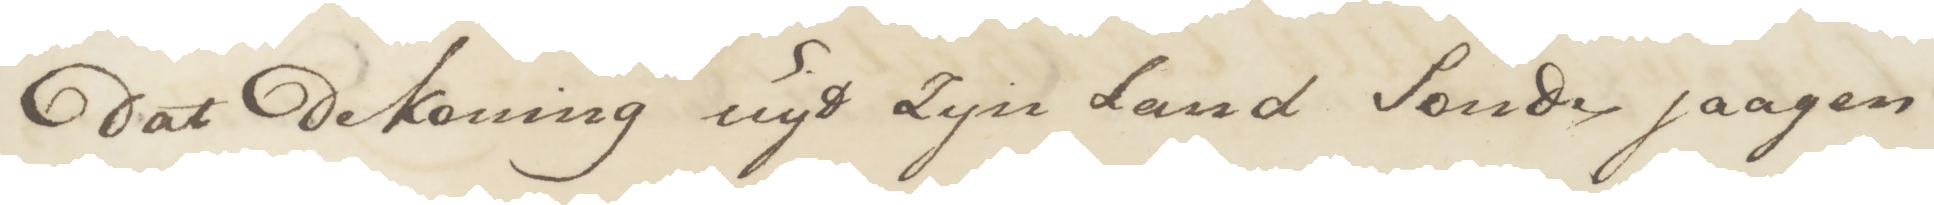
dat dekoning uijt zyn land soude jaagen
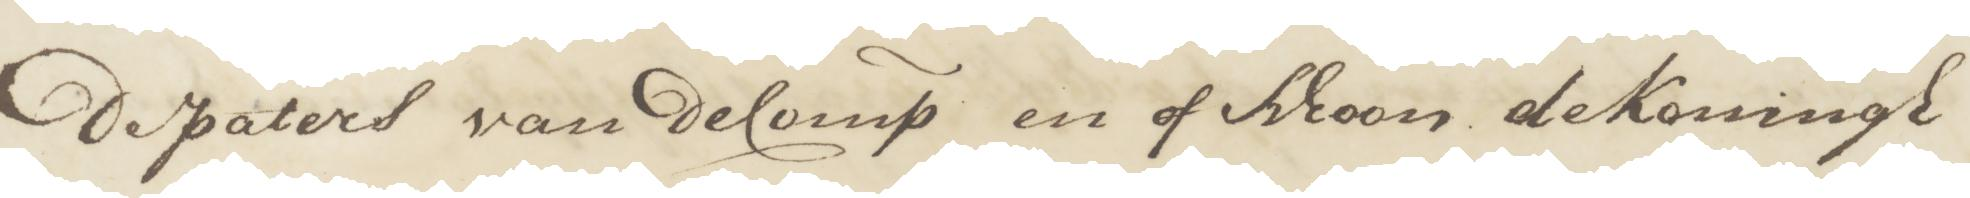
de paters van de Comp en of schoon dekoningh
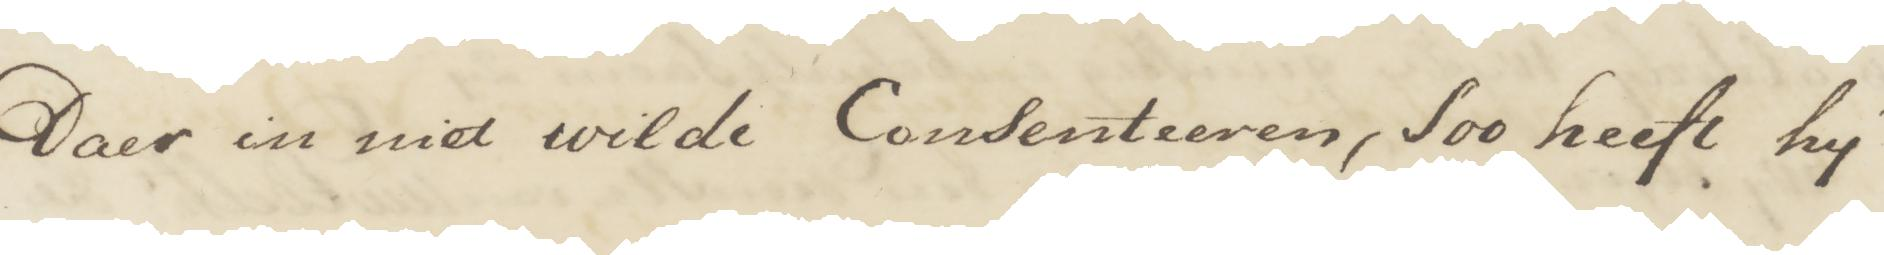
daer in niet wilde Consenteeren, soo heeft hij
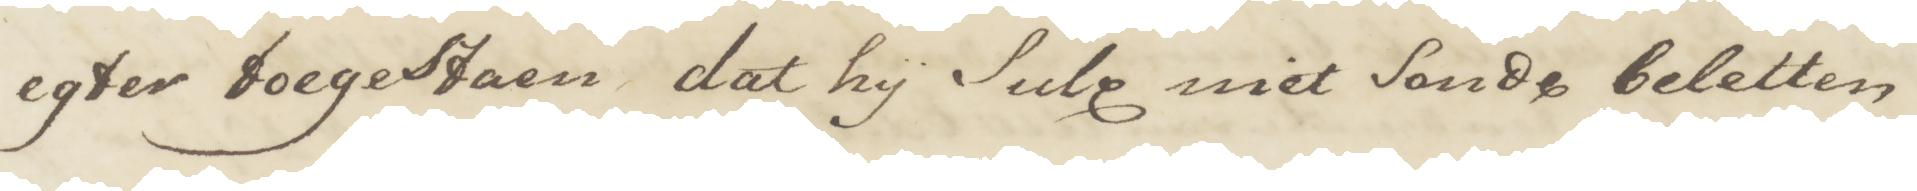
egter toegestaen dat hij sulx niet soude beletten
